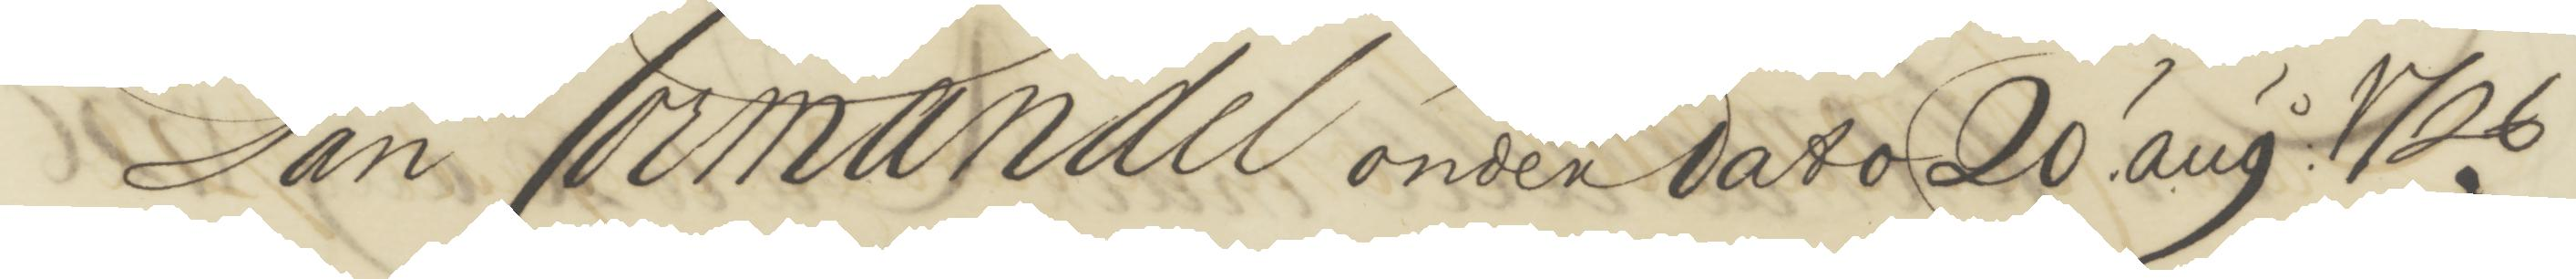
Van Cormandel onder dato 20.' aug:o 1726
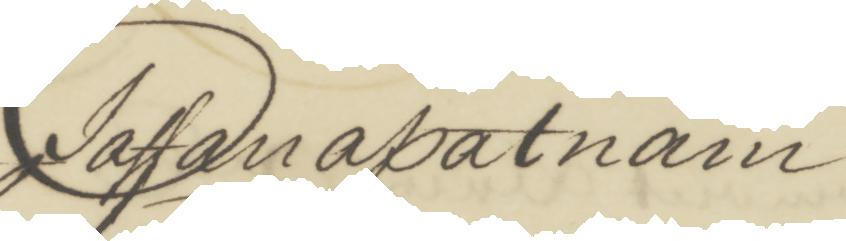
Iaffanapatnam
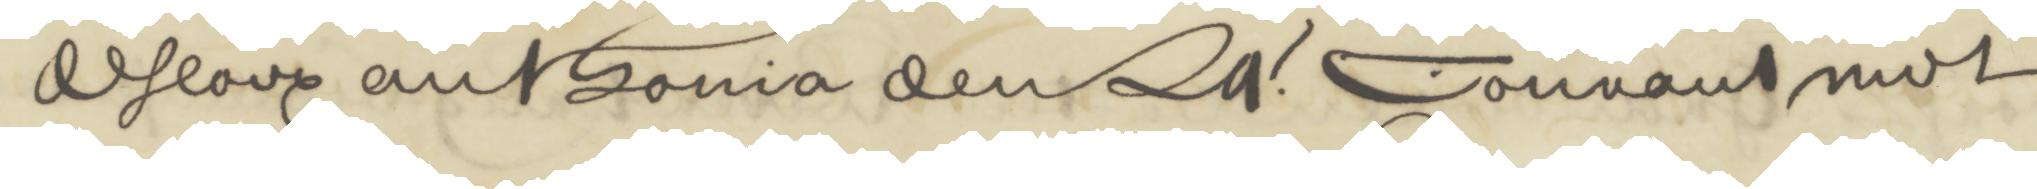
desloep anthonia den 24.' Courant met
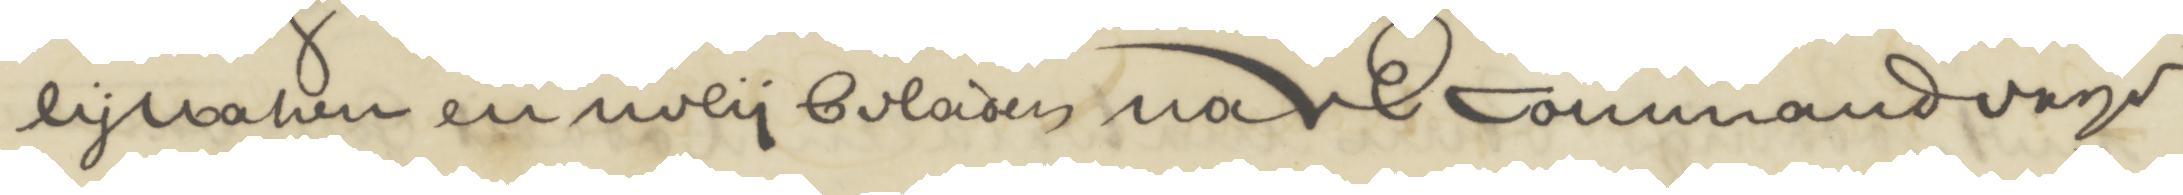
lijwaten en nelij beladen na VE commanderije
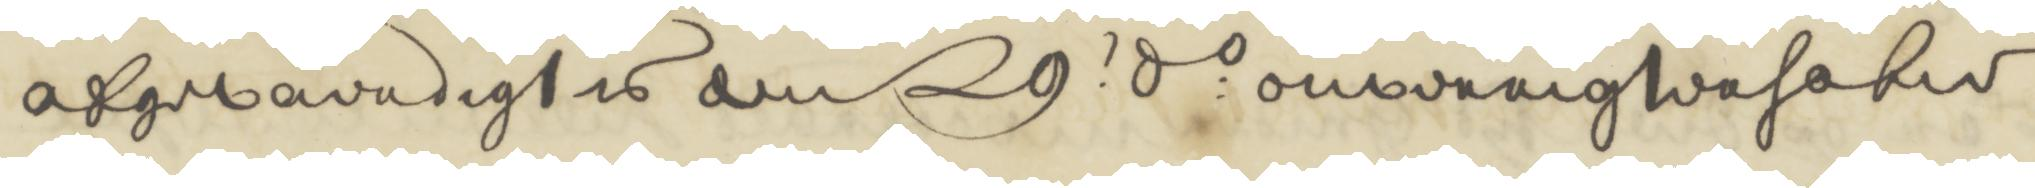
afgevaerdigt is den 29.' d:o onverrigtersake
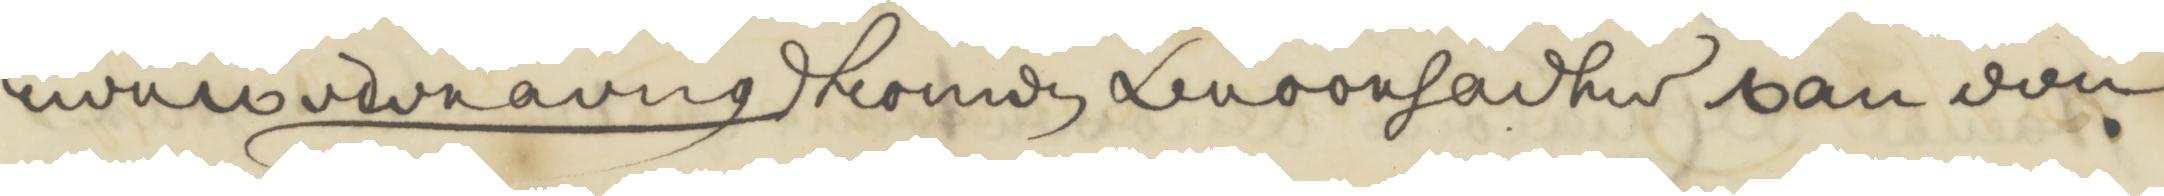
hier weder aengekomen ter oorsaeke van een
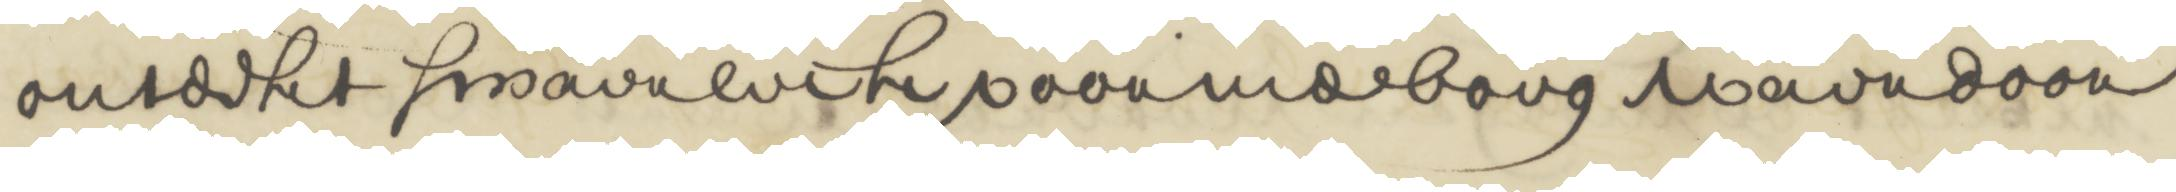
ontdekt swaer leck voor indeboeg waerdoor
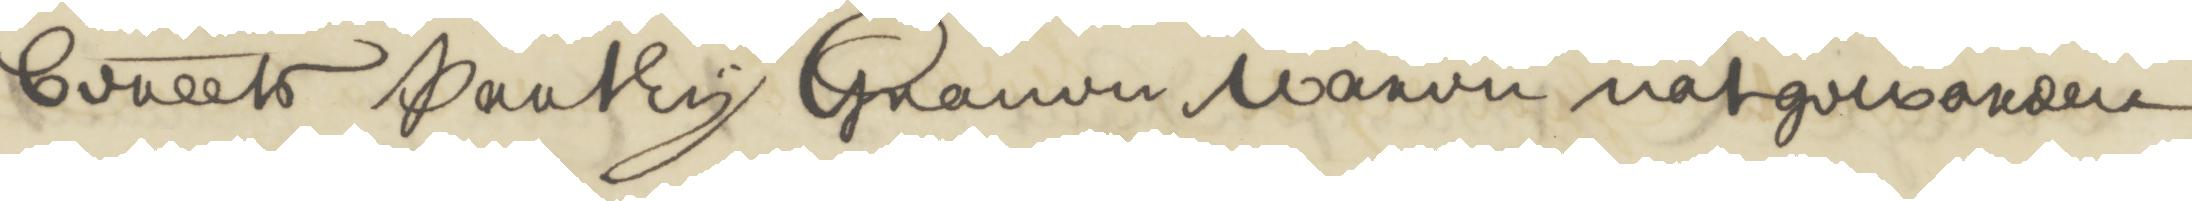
bereets Parthij Granen waren nat geworden
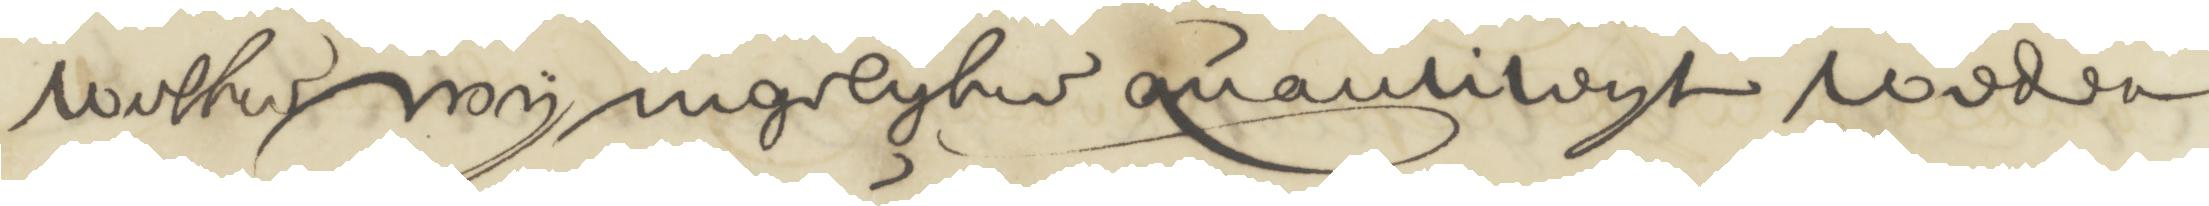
welke wij ingelijke quantiteyt weder
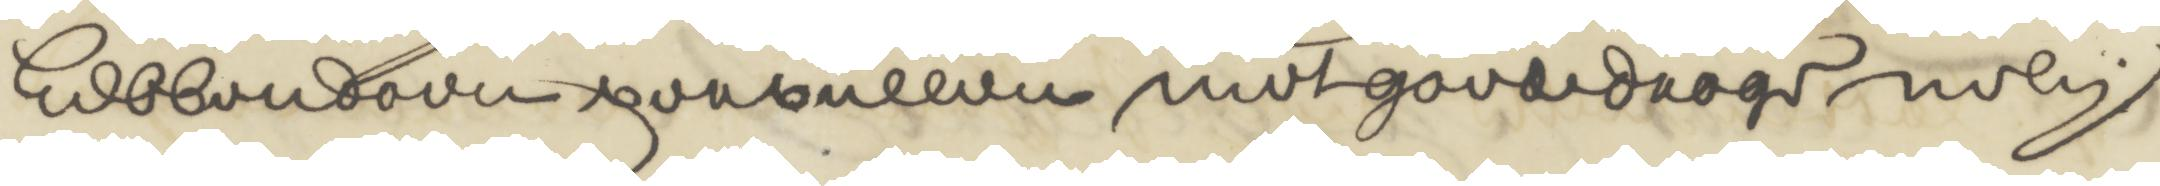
hebben doen vervullen met goede droge nelij
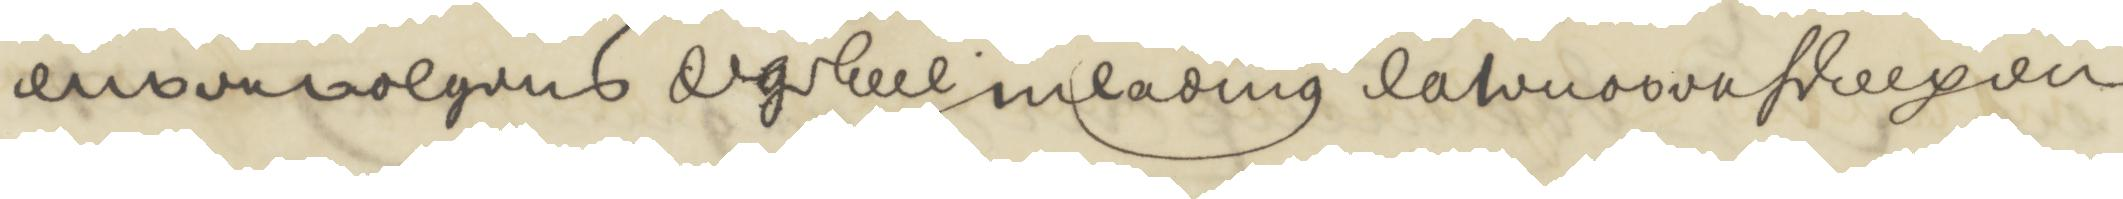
en vervolgens de geheel inlading laten overscheepen
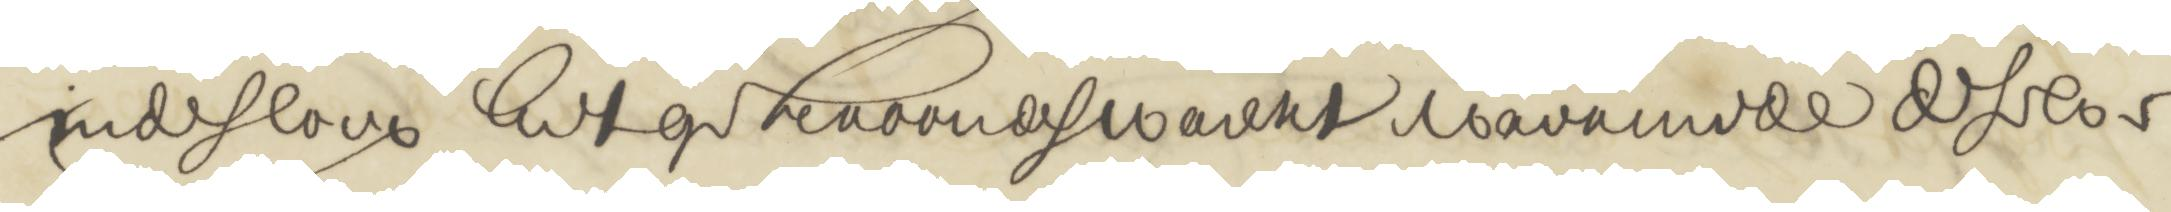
in de sloep het gekroonde swaert waermede deselve
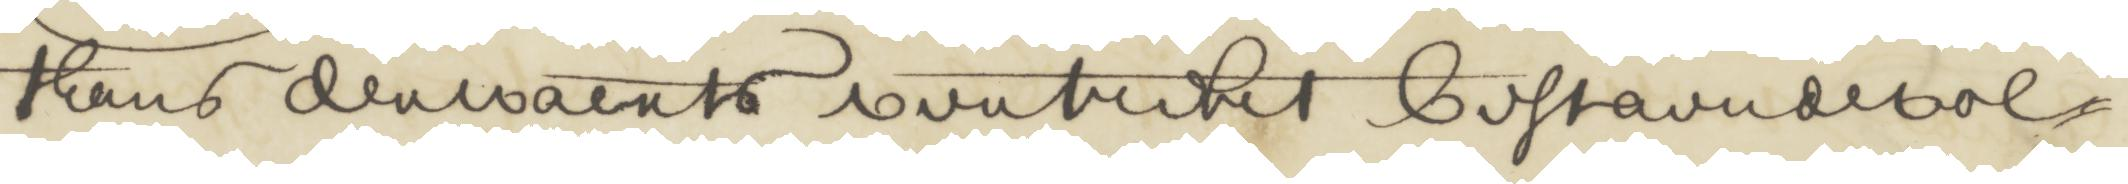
thans derwaerts vertrekt bestaende vol„
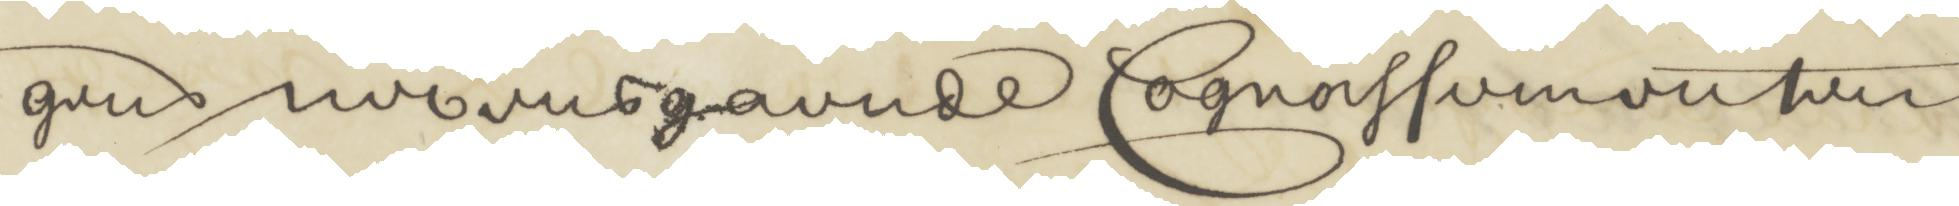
gens nevens gaende Cognoissementen
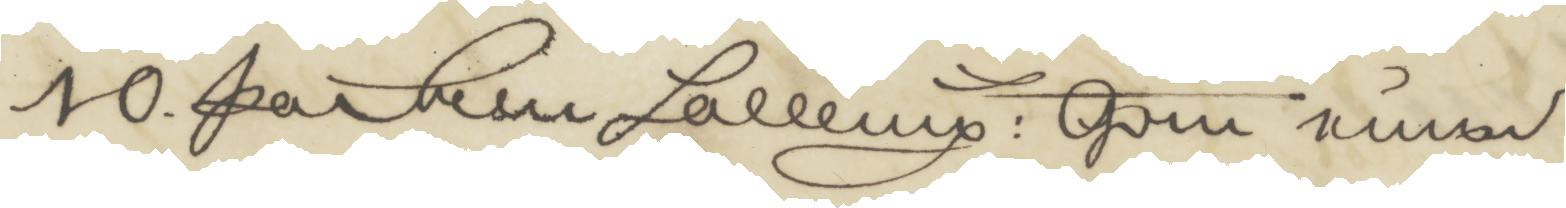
10. packen sallemp: Gem: ruwe
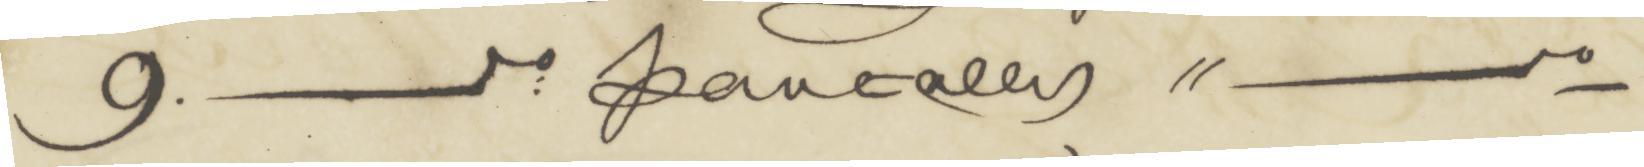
9. D:o parcallen „ D-o
